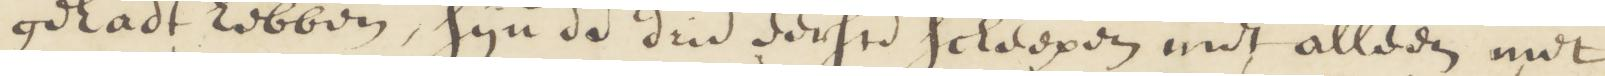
gehadt hebben, sijn de die eerste scheepen met alleen met
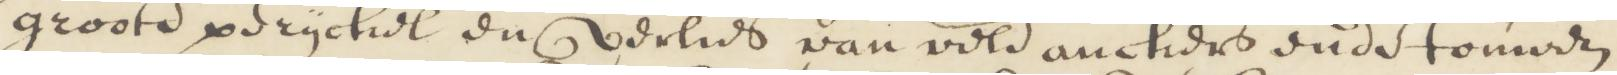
groote perijckel en verlies van vele anckers ende tonnen
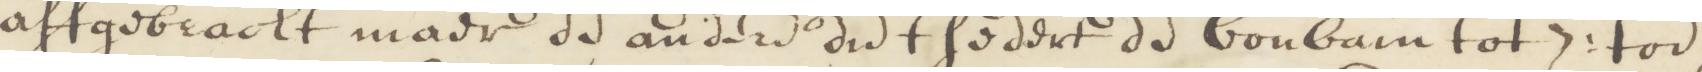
affgebracht maer de andere die t sedert de bonbain tot 7: toe
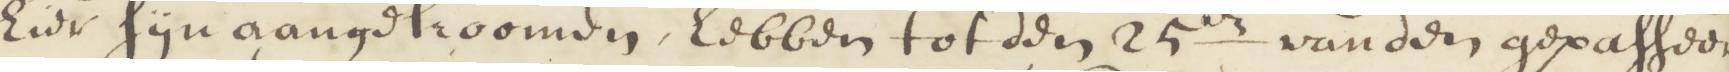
hier sijn aangekomen, hebben tot den 25-en van den gepasseer
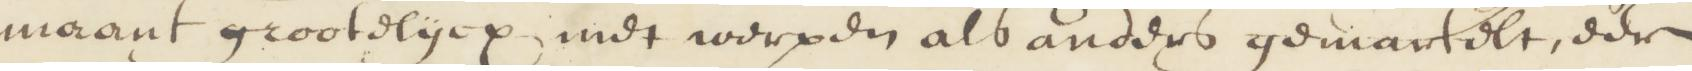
maant grootelijcx met werpen als anders gemartelt, eer
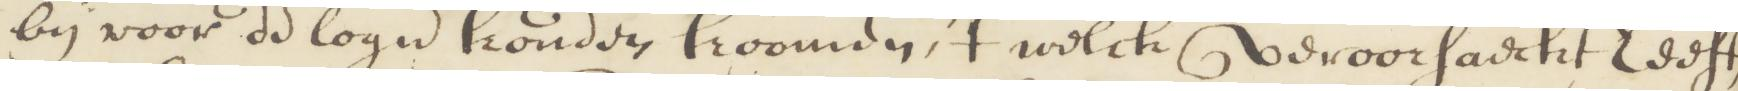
bij voor de logie konden koomen, 't welck veroorsaeckt heeft,
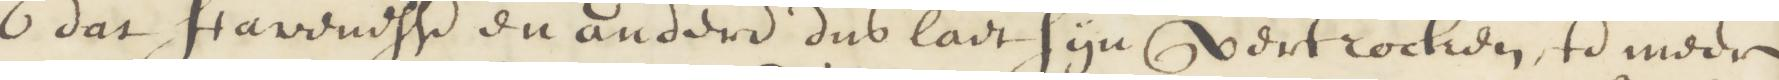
dat Stavenesse en andere die laet sijn vertrocken, te meer
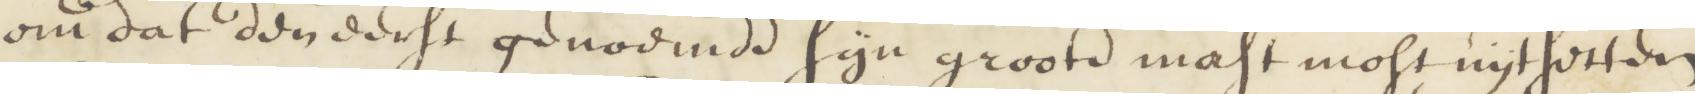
om dat den eerst genoemde sijn groote mast most uijtsetten
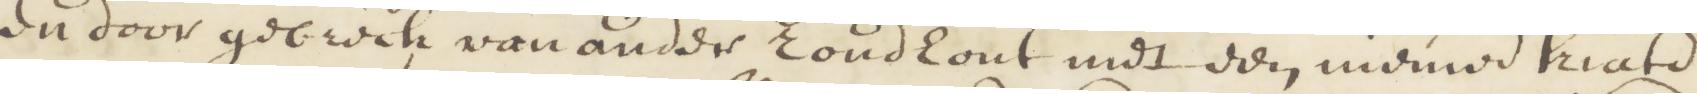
en door gebreck van ander rondhout met een nieuwe kiate
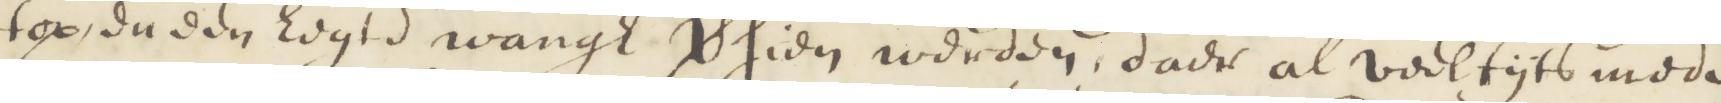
top, en een hegte wangh versien werden, daer al veeltijts mede
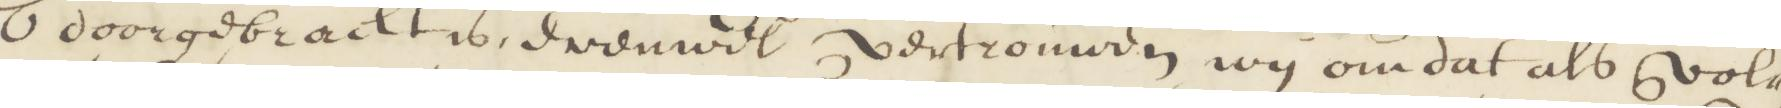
door gebracht is, evenwel vertrouwen wij omdat als vol
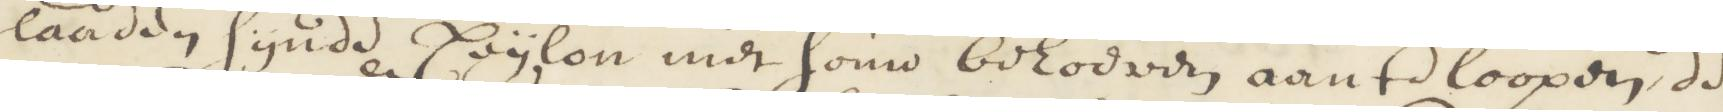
laaden sijnde Ceijlon niet souw behoeven aan te loopen, de
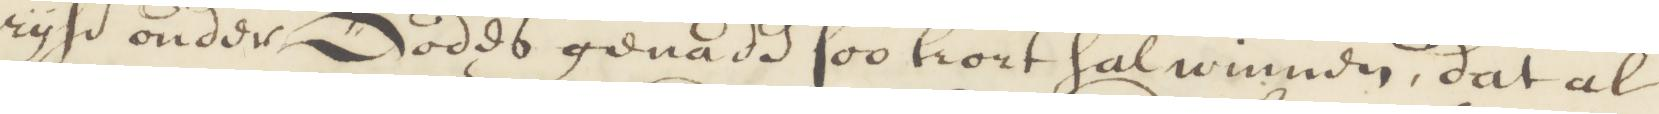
rijse onder Godes genade so kort sal winnen dat al
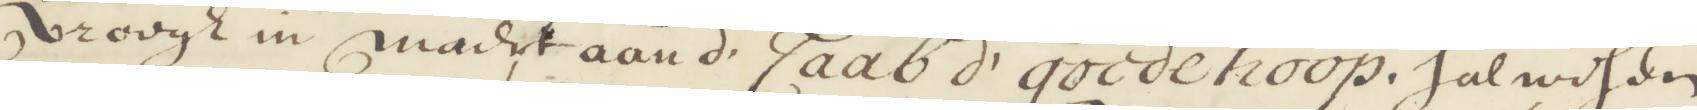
vroegh in maert aan d' Caab d' goedehoop sal wesen,
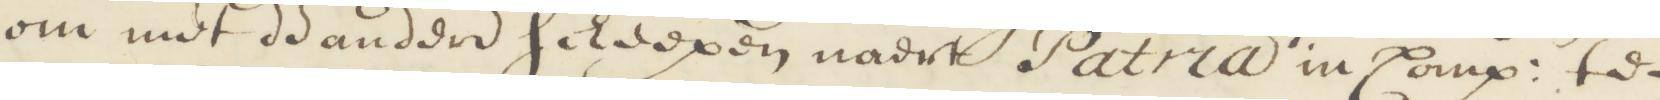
om met de andere scheepen naart Patria in Comp: te
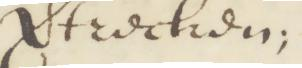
vertrecken;
